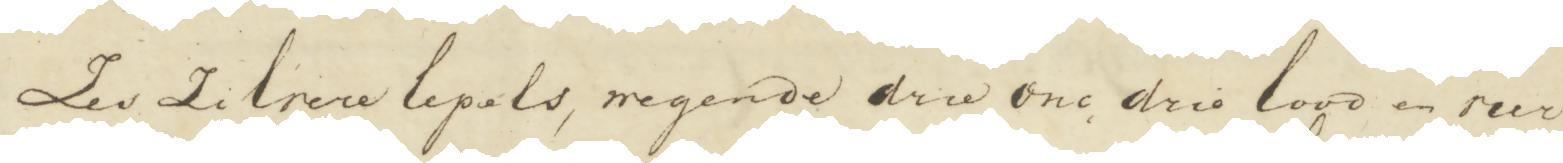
Zes Zilvere lepels, wegende drie onc, drie lood en vier
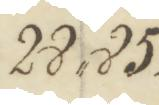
ƒ 28.85.
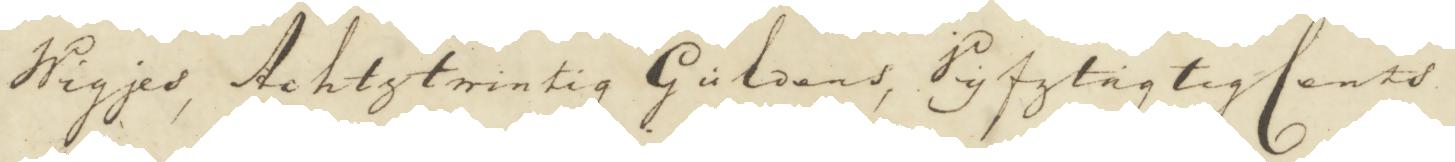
Wigjes, Achtentwintig Guldens, Vijfentagtig Cents.
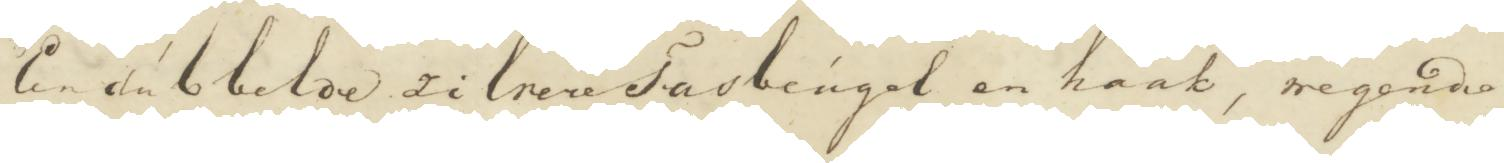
Een dubbelde zilvere Tasbeugel en haak, wegende
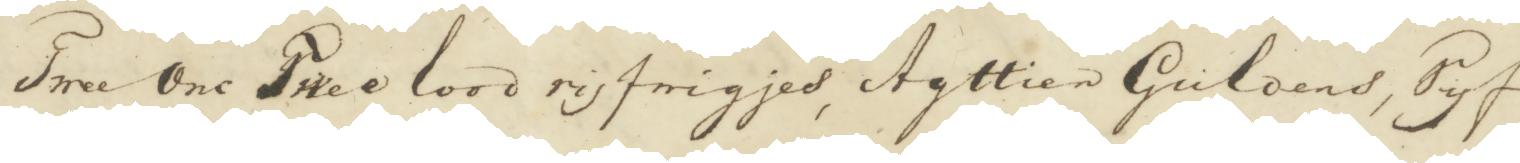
Twee onc Twee lood vijfwigjes, Agttien Guldens, Vijf
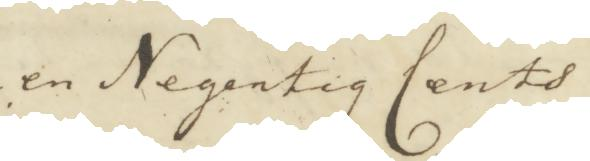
en Negentig Cents
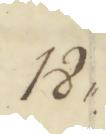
18„
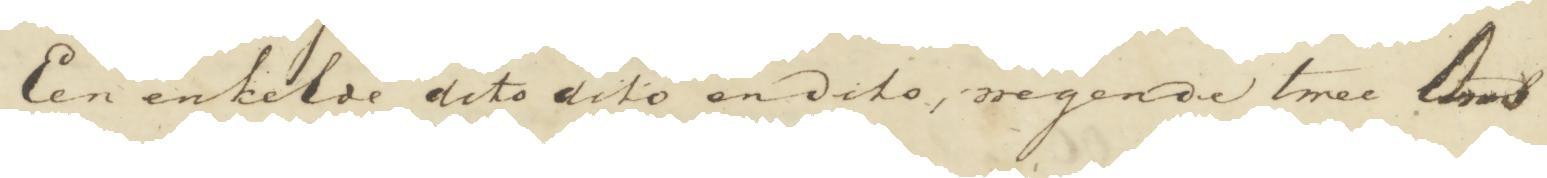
Een enkelde dito dito en dito, wegende twee Ons
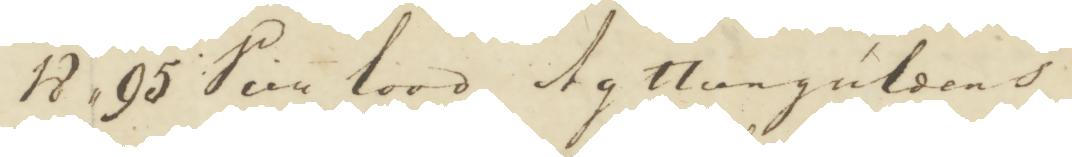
18„95 Vier lood, Agttien guldens.
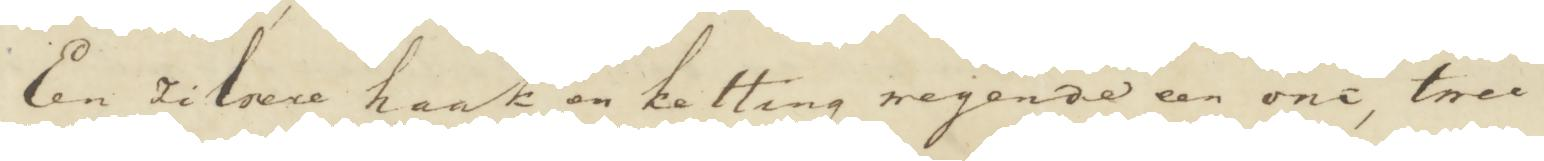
Een zilvere haak en ketting wegende een onc, twee
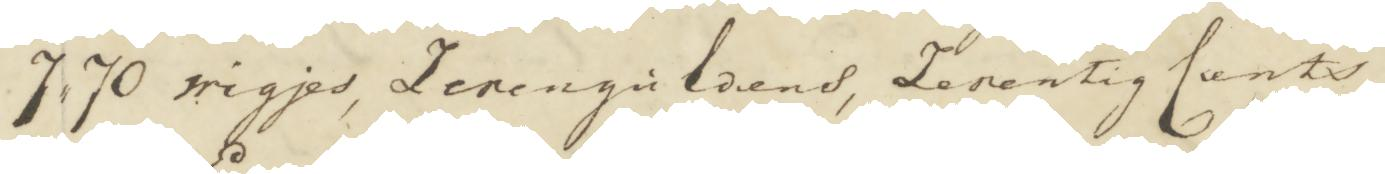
7„70 wigjes, Zevenguldens, Zeventig Cents
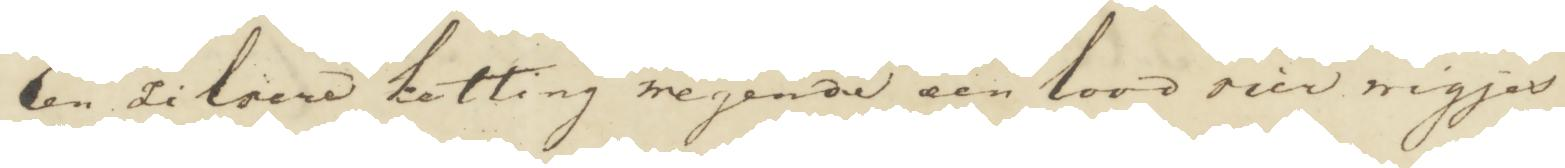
Een zilvere ketting wegende een lood vier wigjes
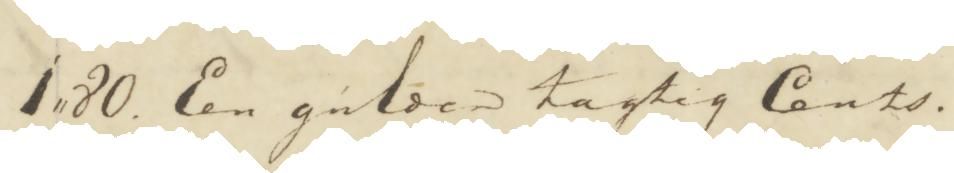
1„80. Een gulden tagtig Cents.
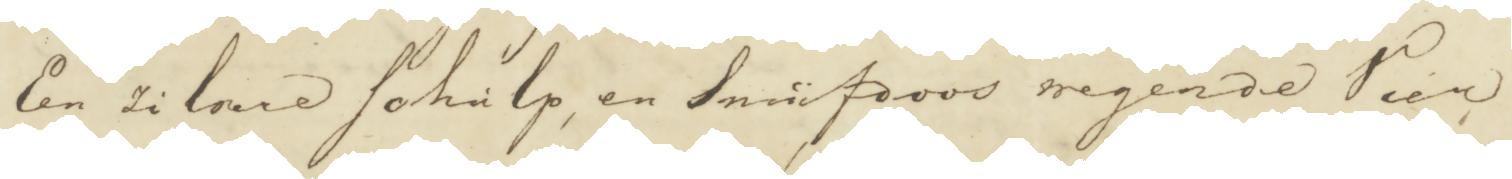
Een zilvere schulp, en Snuifdoos wegende Vier
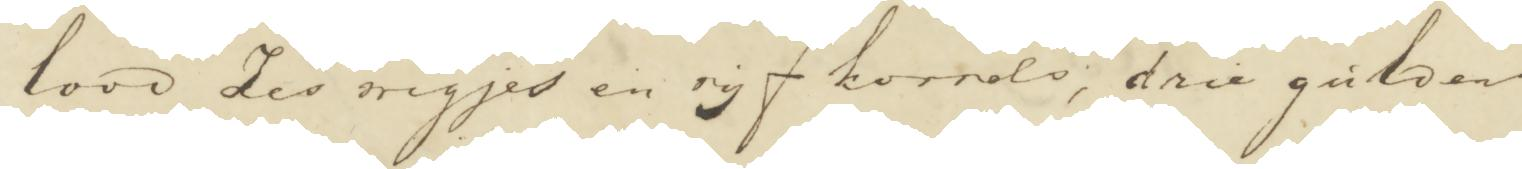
lood Zes wigjes en vijf korrels, drie gulden
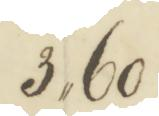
3„60
